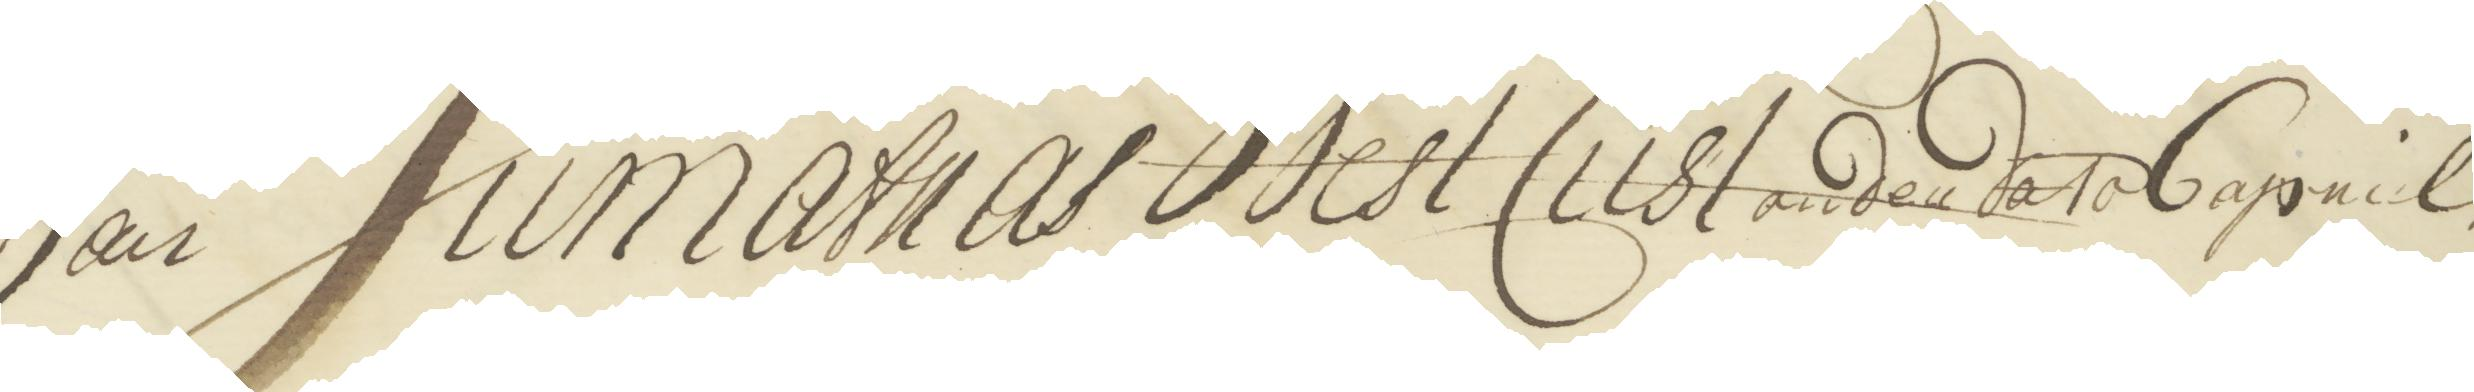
Van Sumatras West Cust onder dato 6 april
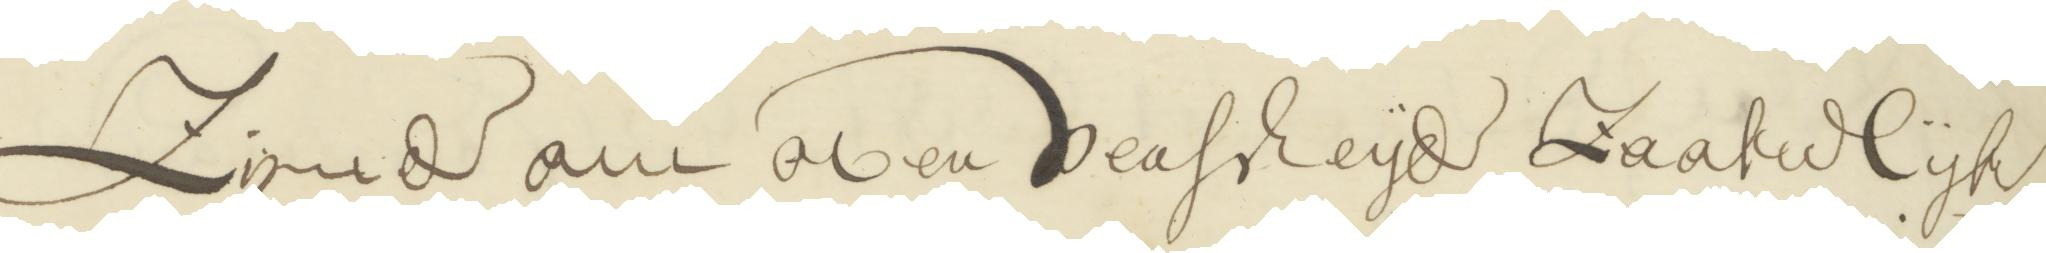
Zijnde om over verscheijde zaakelijk
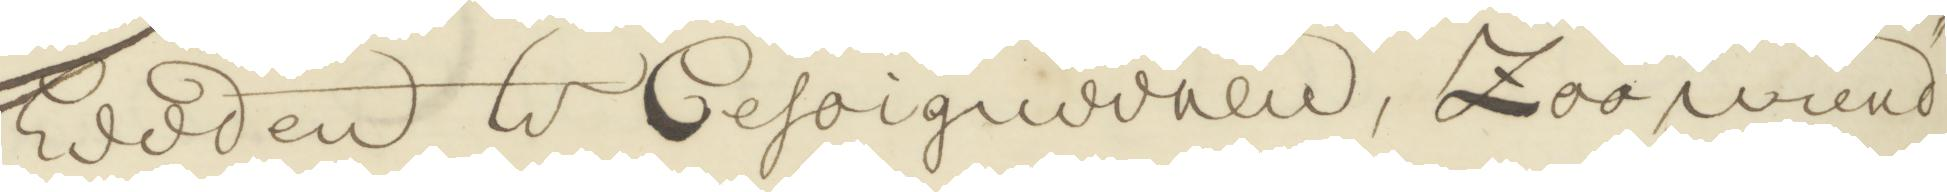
heeden te besoigneeren, zoo wierd
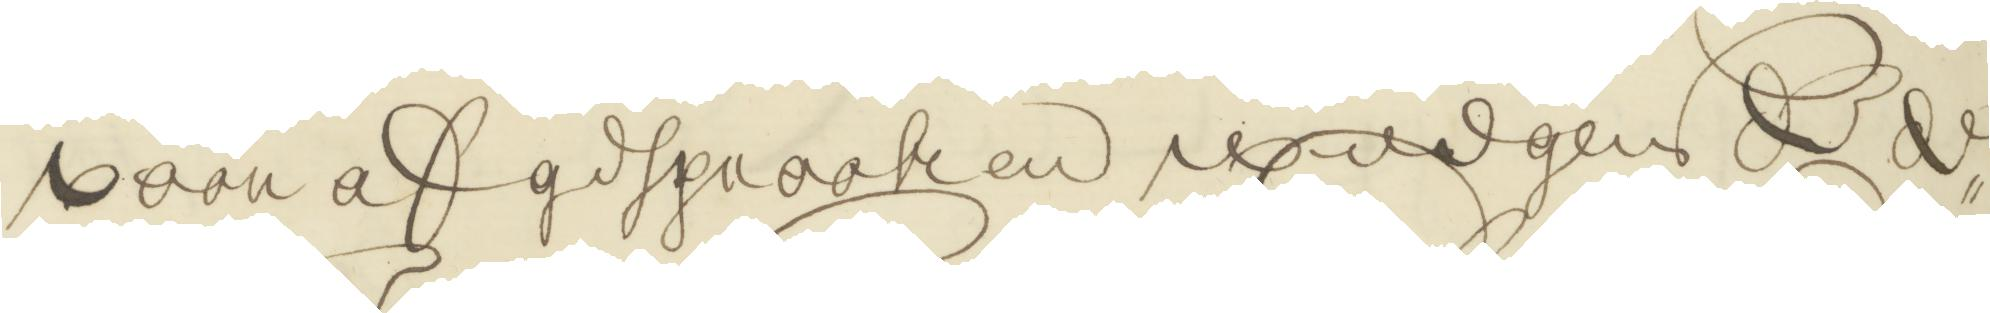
voor afgespraaken weegens de de„
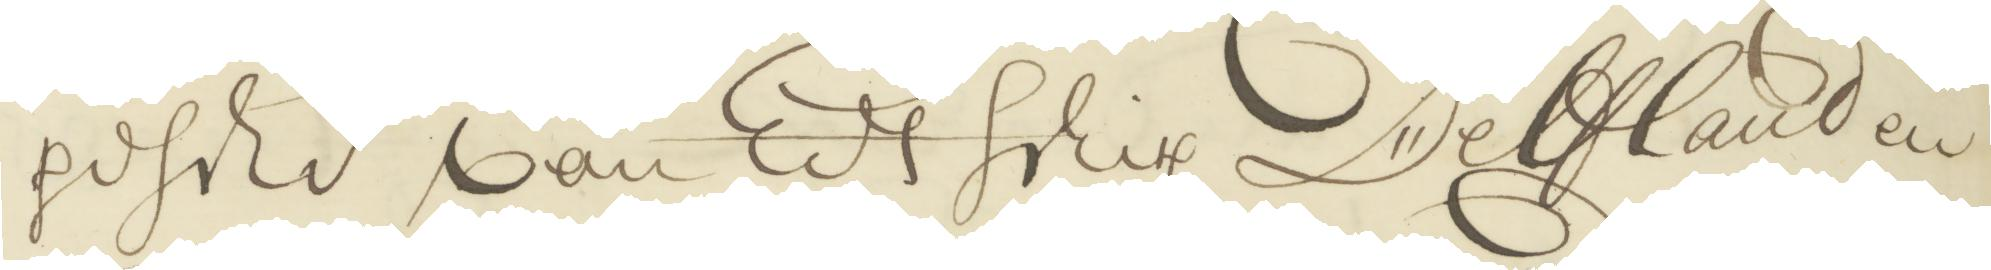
pesche van het schip Delfland en
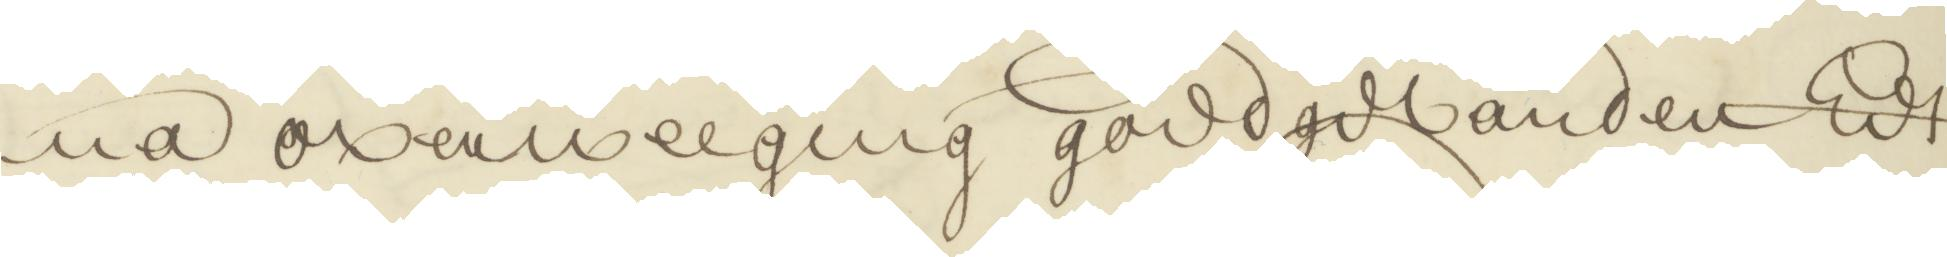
na overweeging goedgevonden het
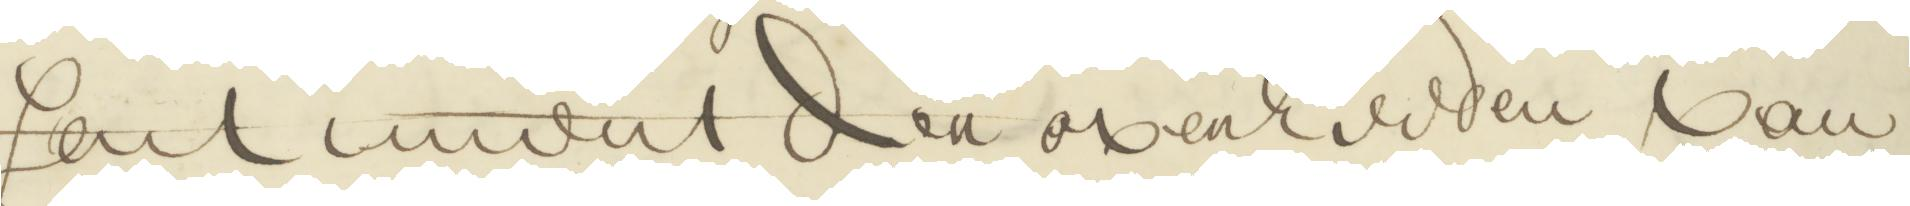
sentiment der overheeden van
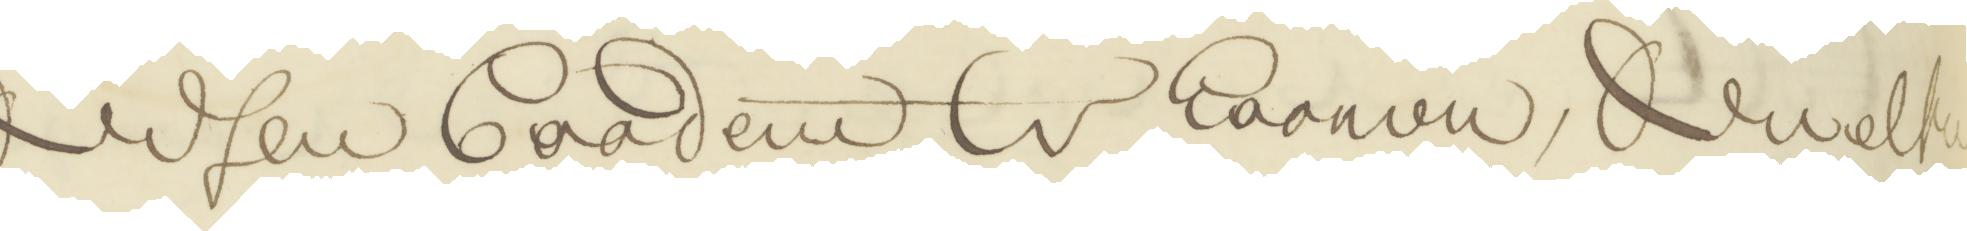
desen boodem te hooren, dewelke
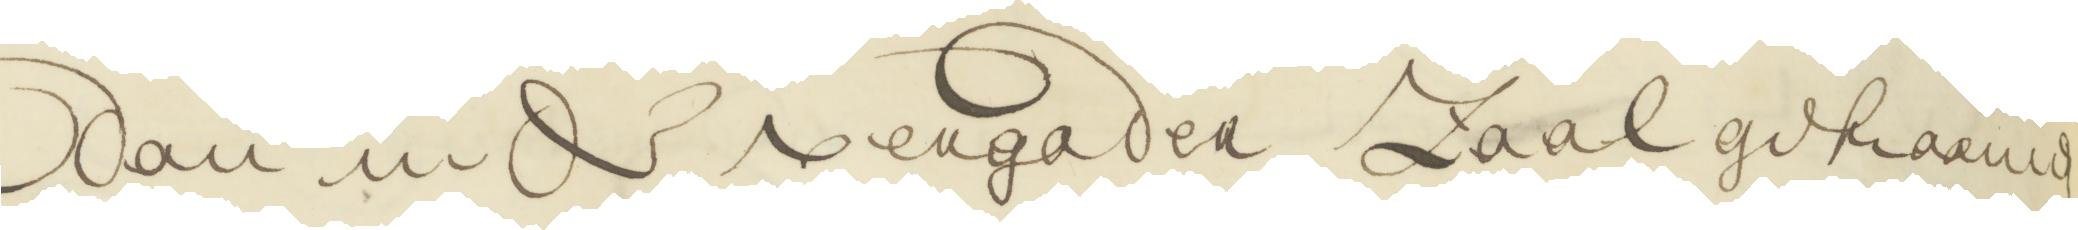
dan in de vergader zaal gekomen
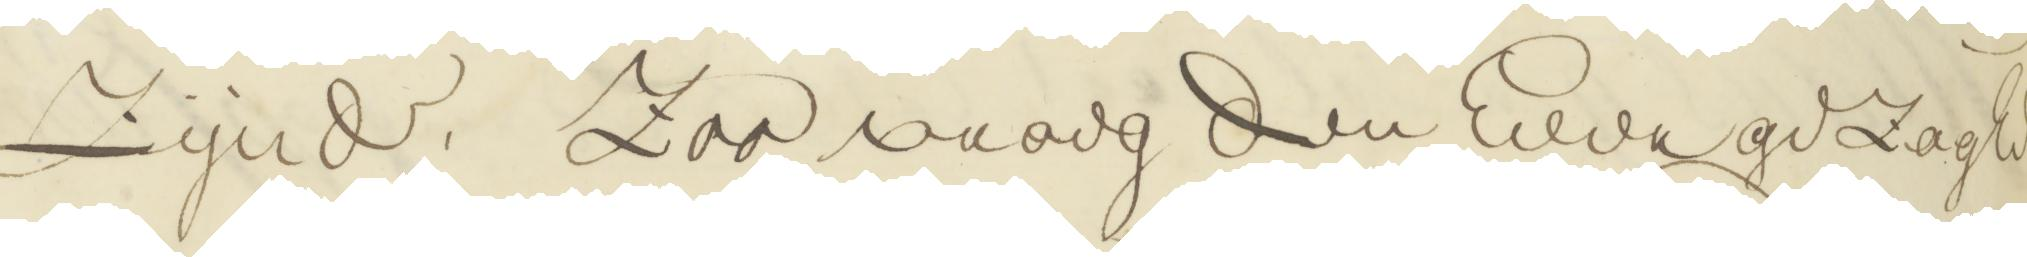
zijnde, zoo vroeg den heer gezagheb
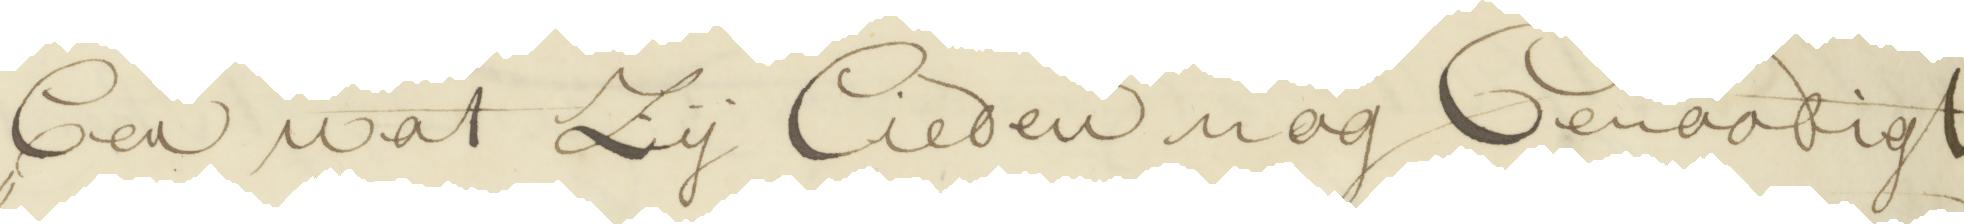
„ber wat zij lieden nog benoodigt
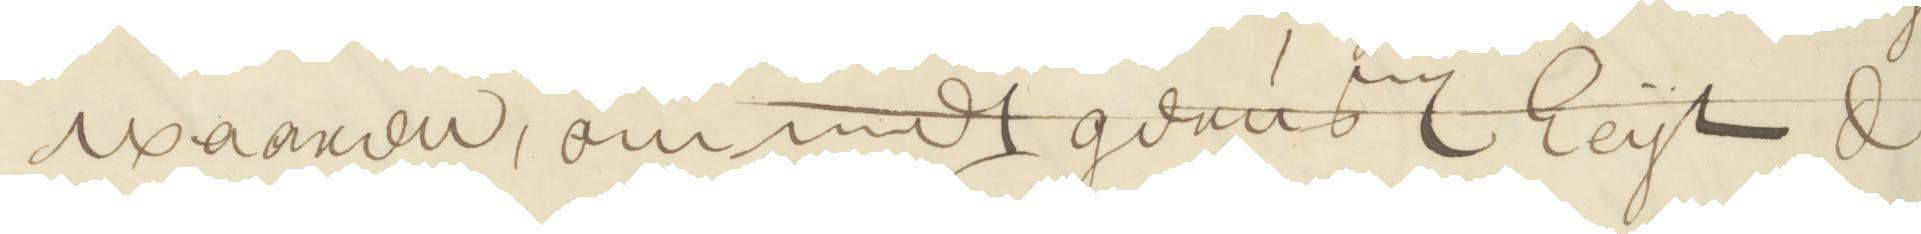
waaren, om met gerustheijt de
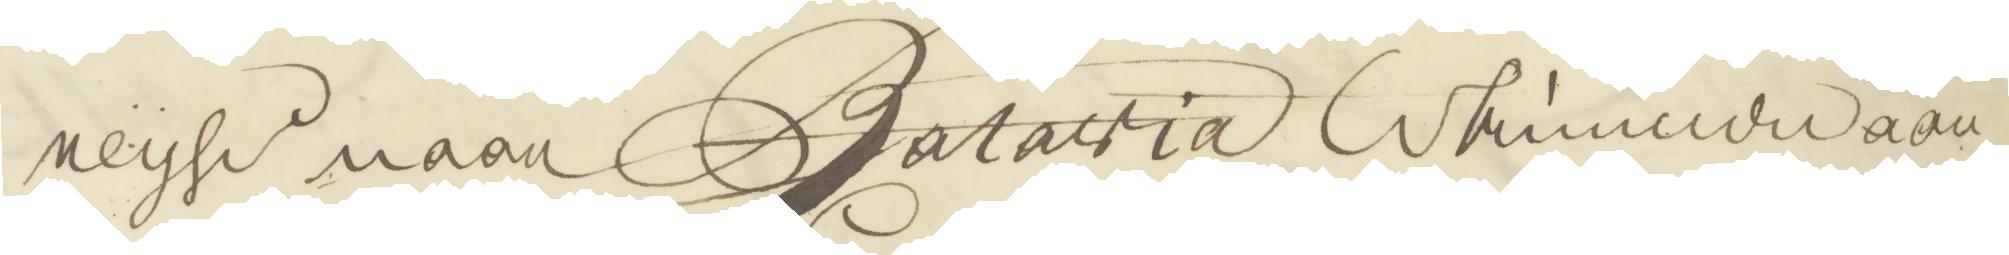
reijse naar Batavia te kunnen aan„
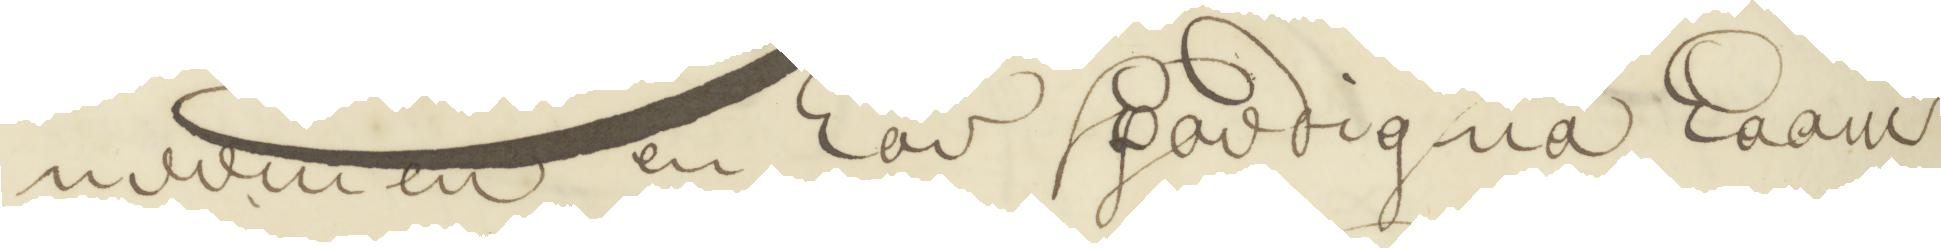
neemen en hoe spoedig na haare
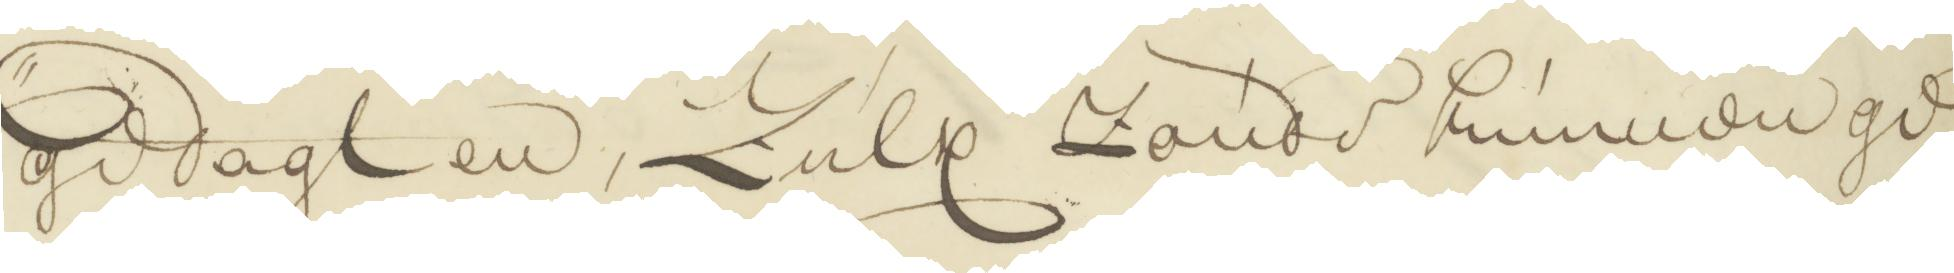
gedagten, zulx zoude kunnen ge
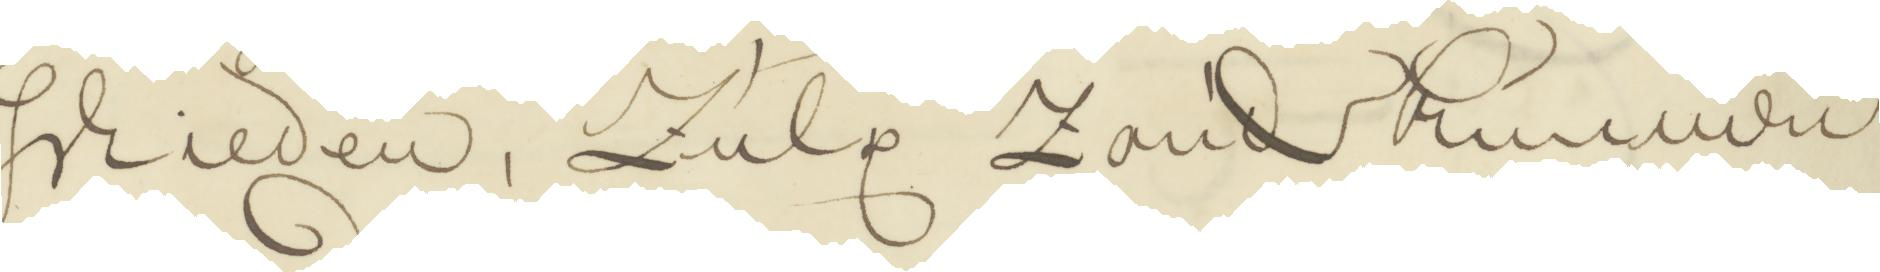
schieden, zulx zoude kunnen
